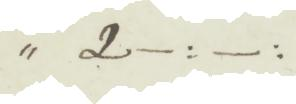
„ 2 —: —:
